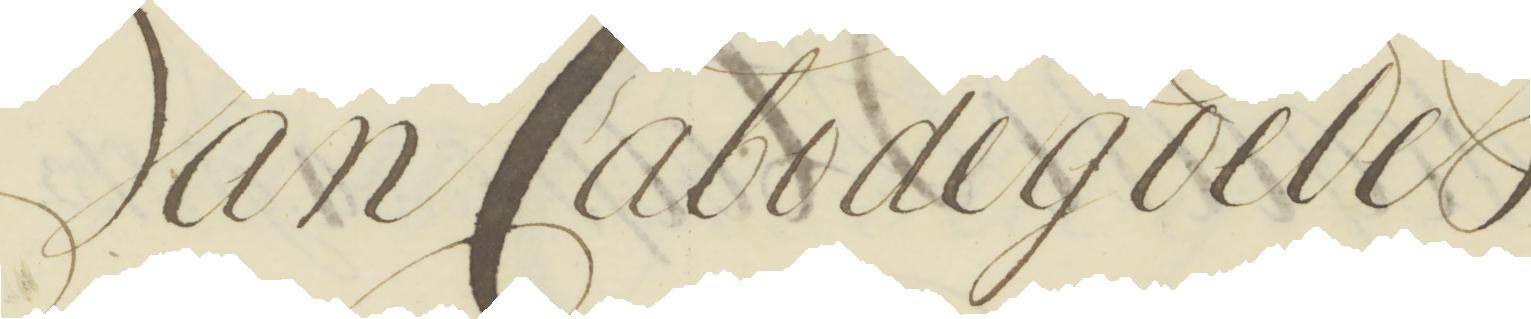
Van Cabo de goede Hoop den 4:' 9b: 1733.
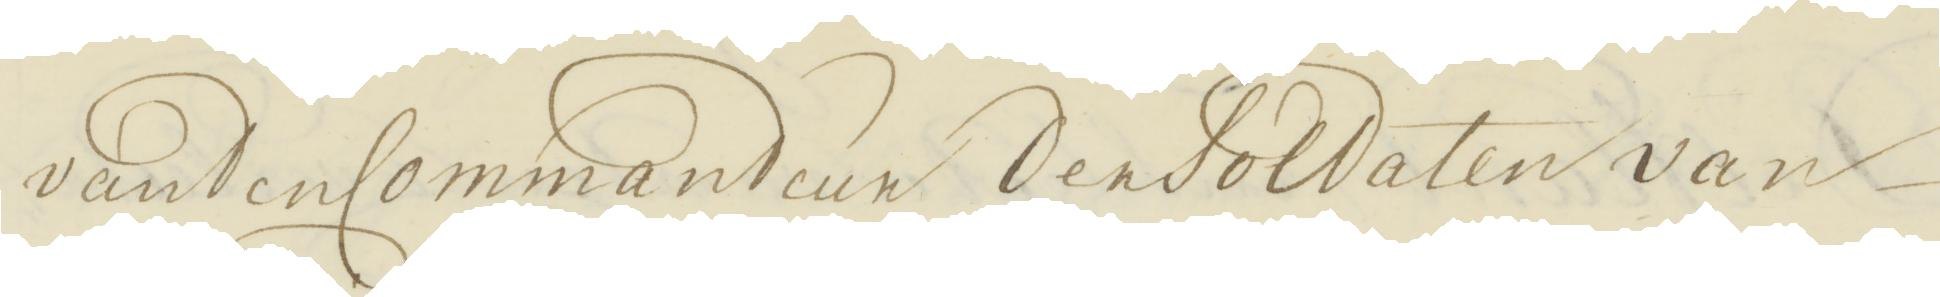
van den Commandeur der soldaten van
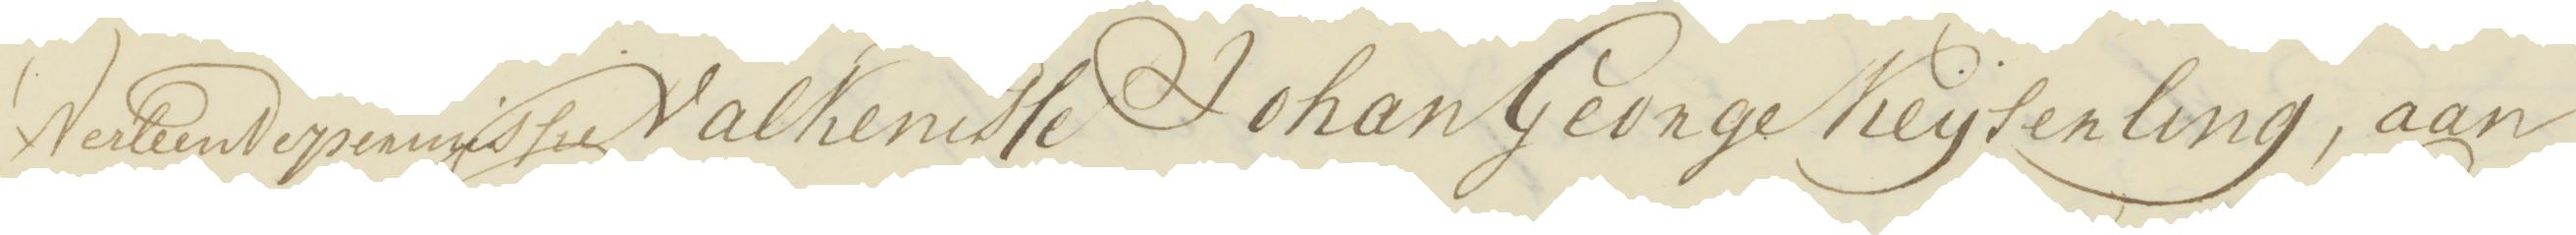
Verleend permissie Valkenisse Johan George Kijserling, aan
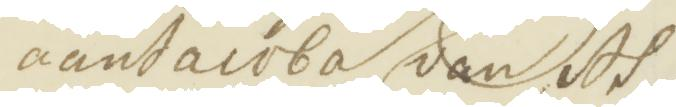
aan jacoba van As
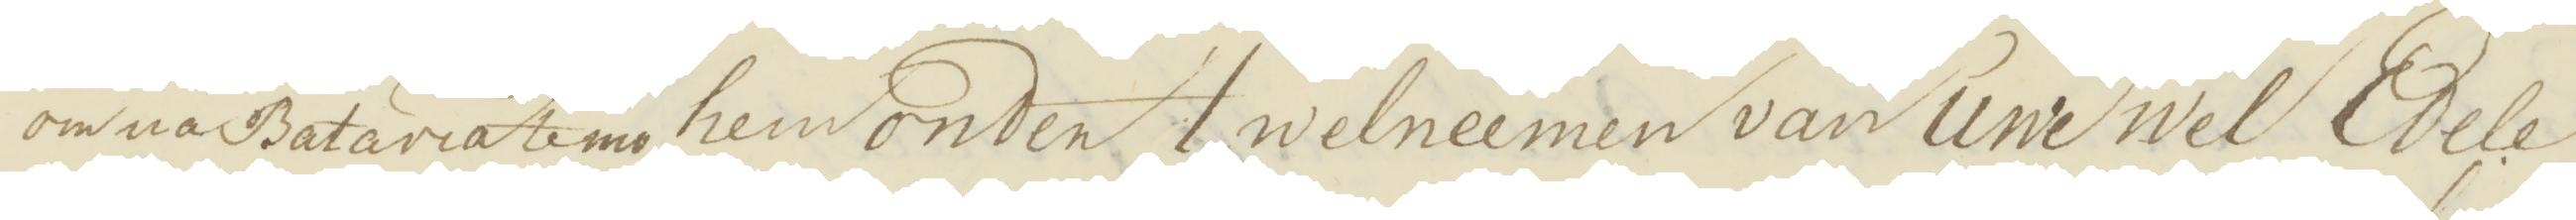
om na Batavia te mo„ hem onder ’t welneemen van uwe wel Edele
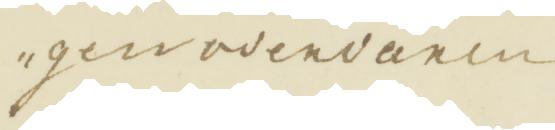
„gen overvaren
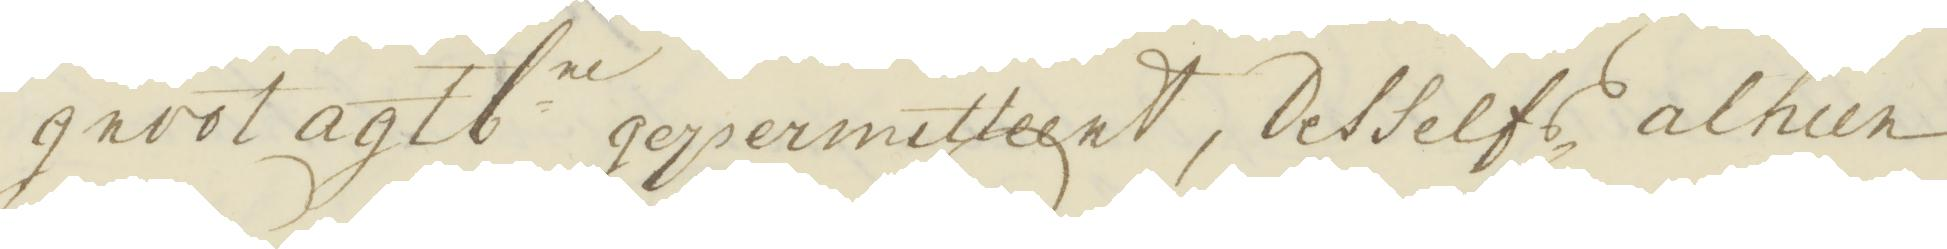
groot agtb:re gepermitteert, desselfs alhier
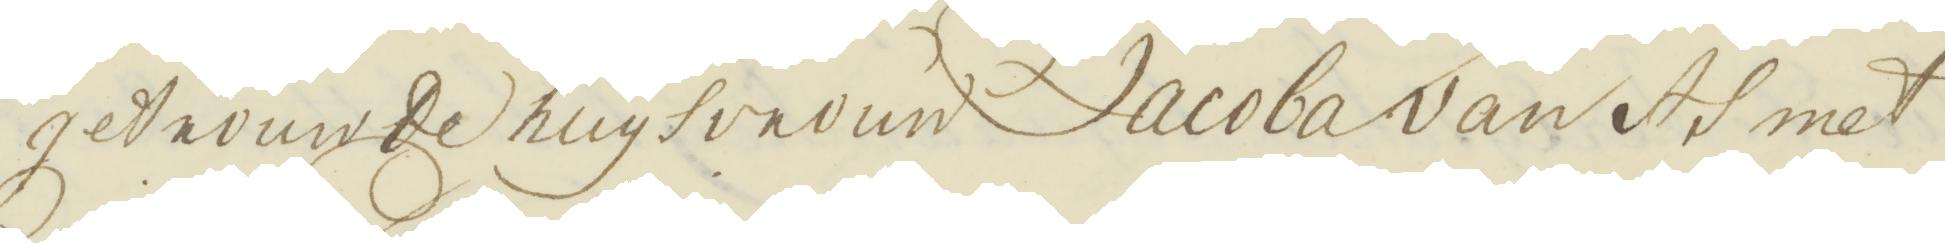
getrouwde huijsvrouw Jacoba van As met
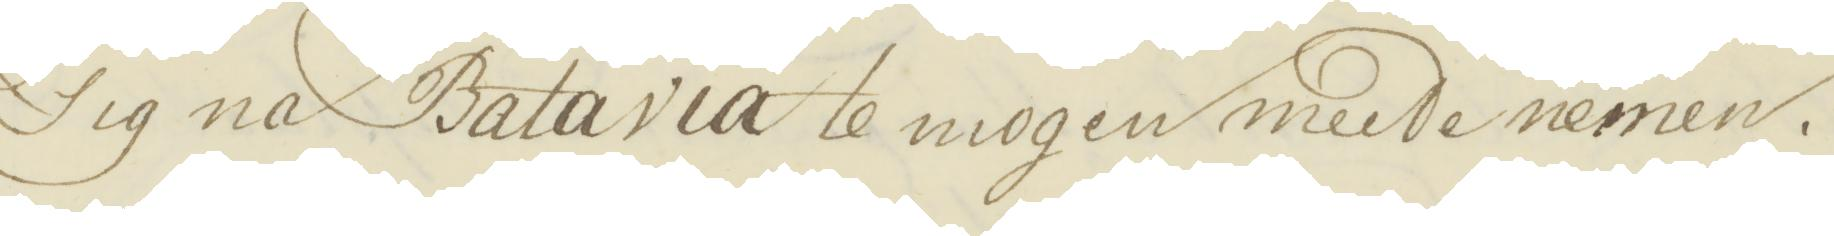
sig na Batavia te mogen meede nemen.
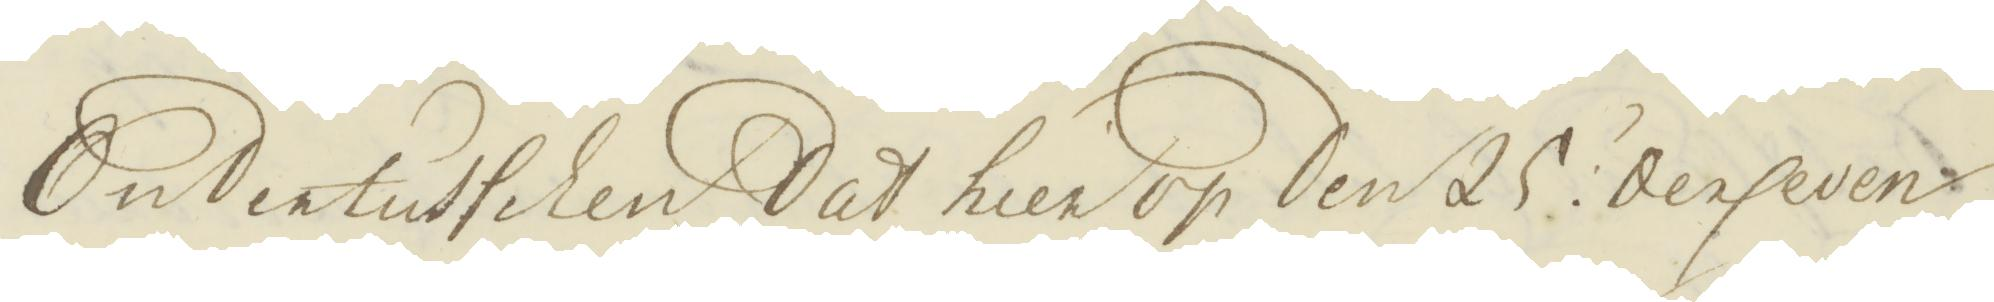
Ondertusschen dat hier op den 25:' derseven
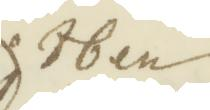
^ 8ber
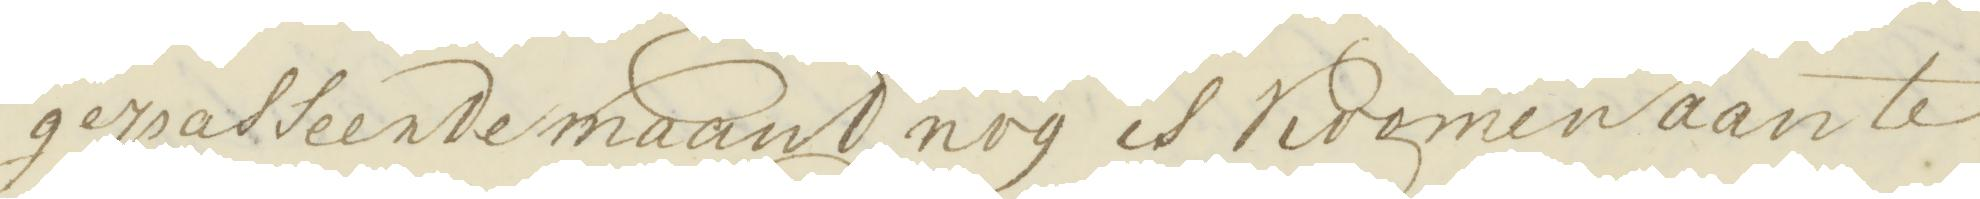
gepasseerde maand nog is koomen aan te
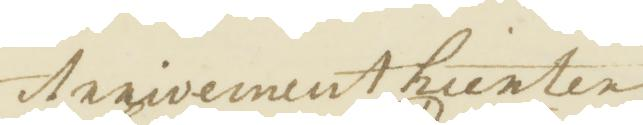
Arrivement hier ter
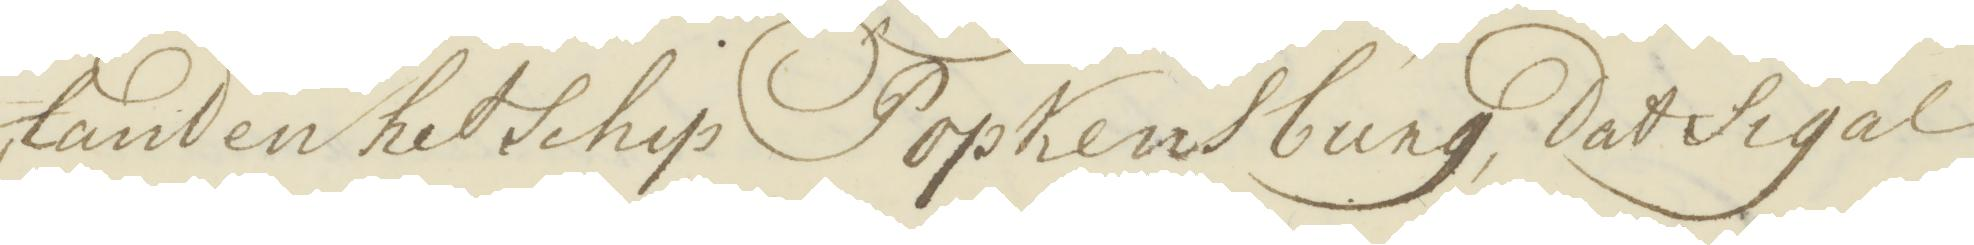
landen het schip Popkensburg, dat sig al
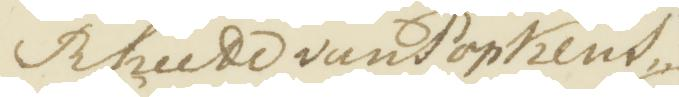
Rheede van Popkens„
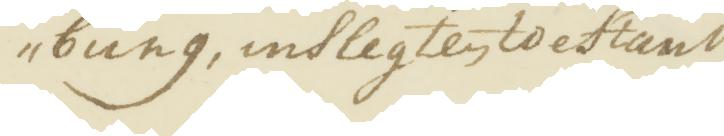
„burg, in slegten toestand.
